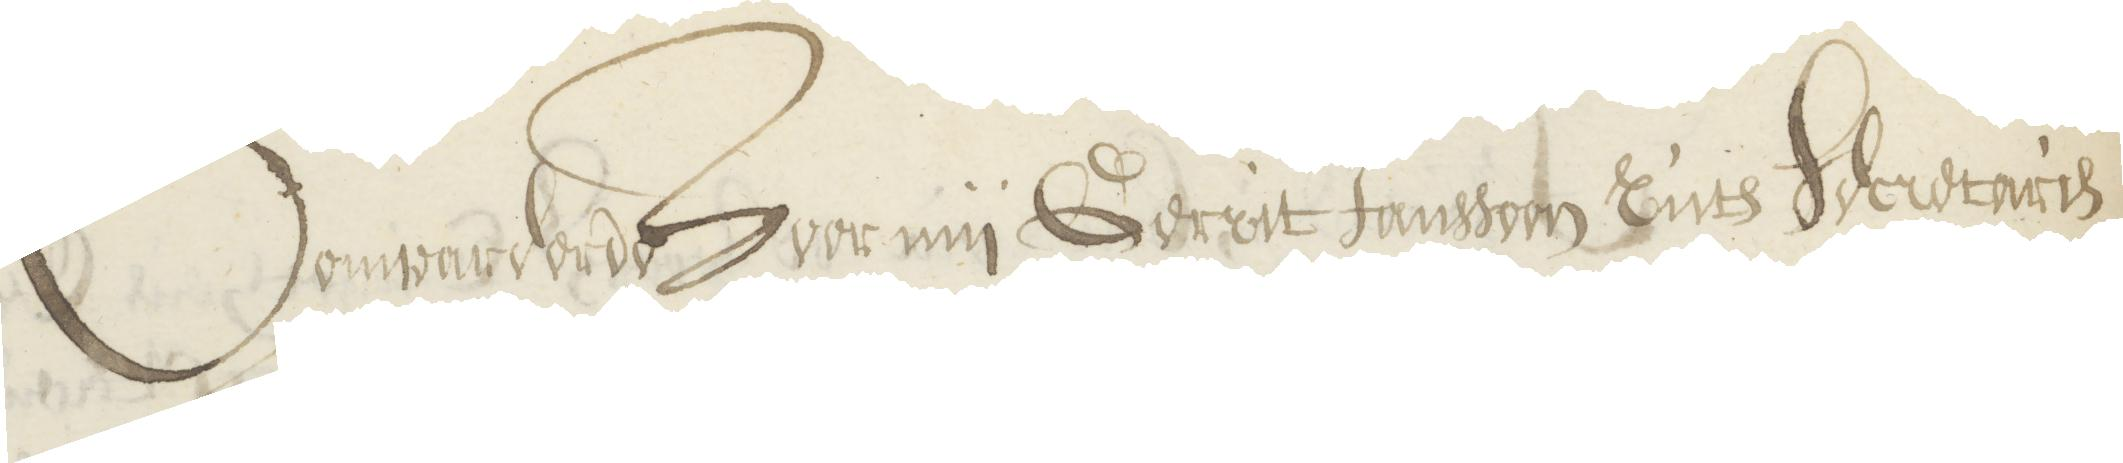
Compareerde Voor mij Gerrit Janssoon ruts Secretaris
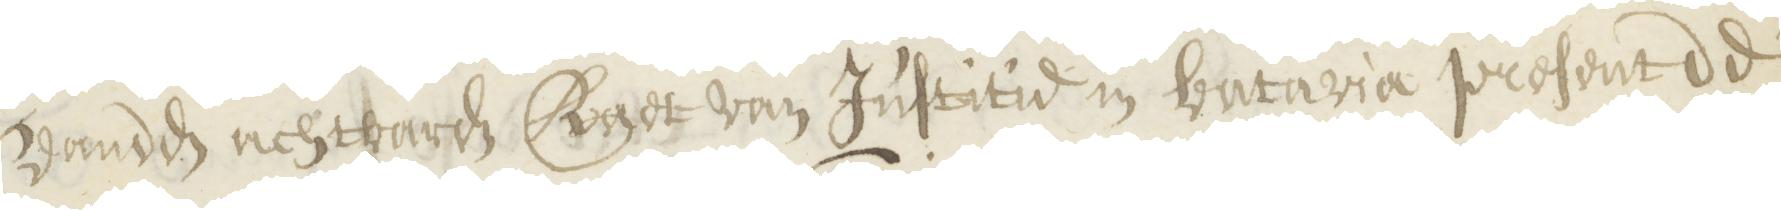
van den achtbaren Raet van Justitie in batavia present de
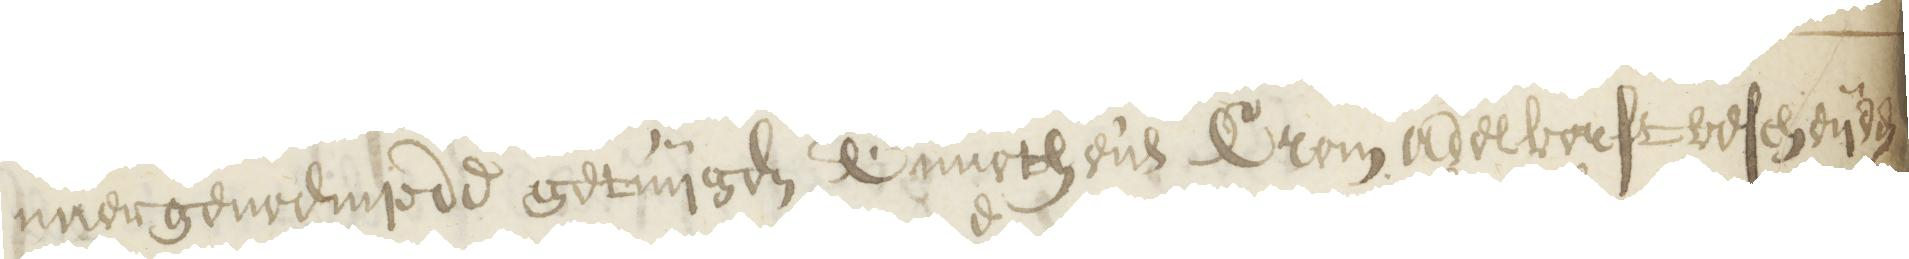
naer genoempde getuijgen Timotheus Crom adelborst bescheijden
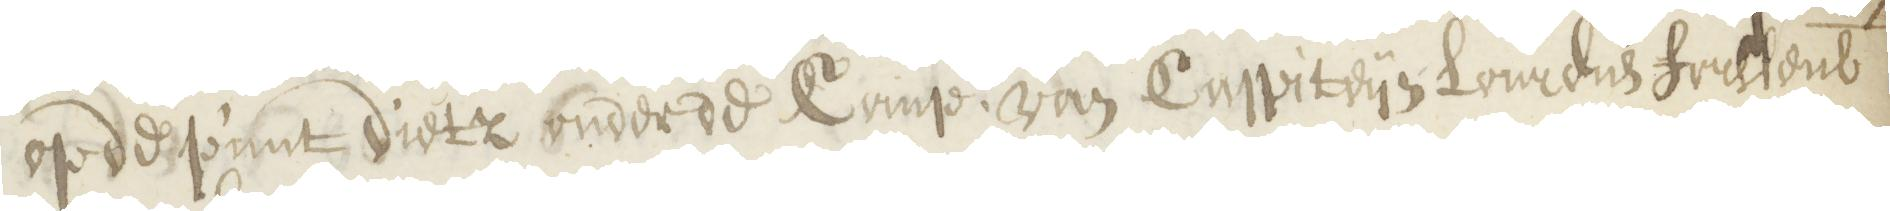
op de punt dietz onder de Comp„e van Cappiteijn Lourens faessens
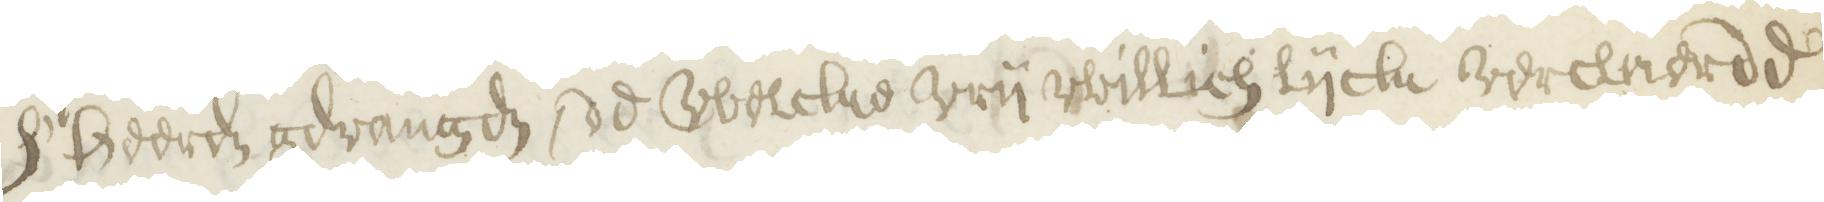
S’ Heeren gevangen, de welcke vrij willichlijck verclaerde
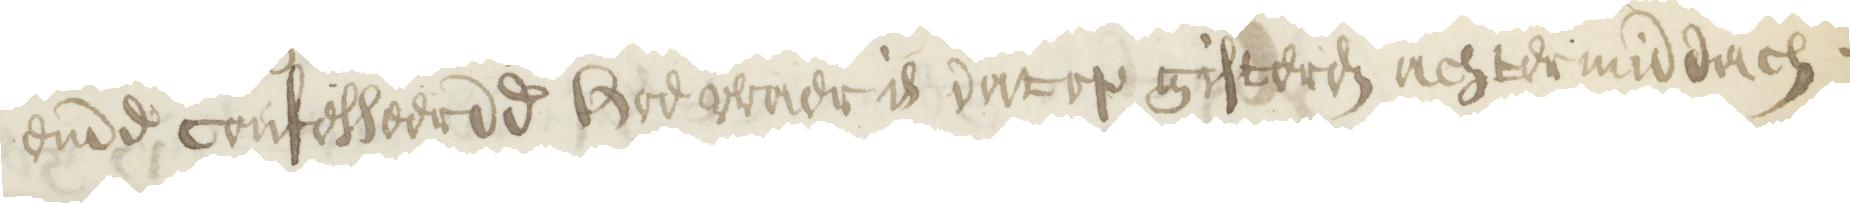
ende confesseerde Hoe waer is dat op gisteren achter middach
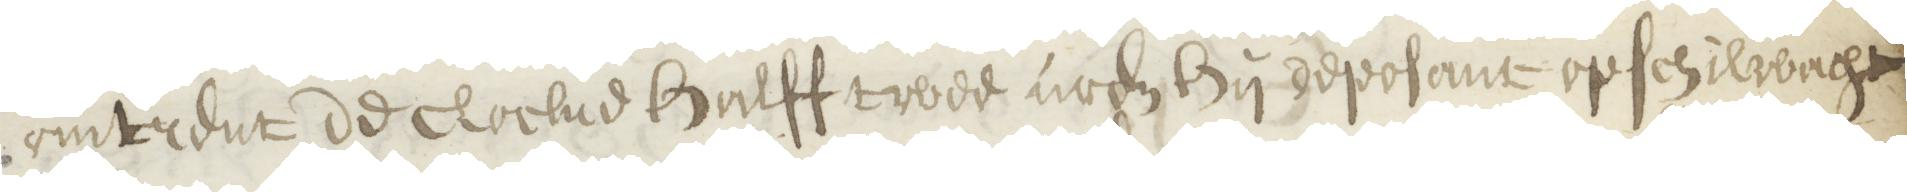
omtrent de clocke halff twee uren hij deposant op schilwacht
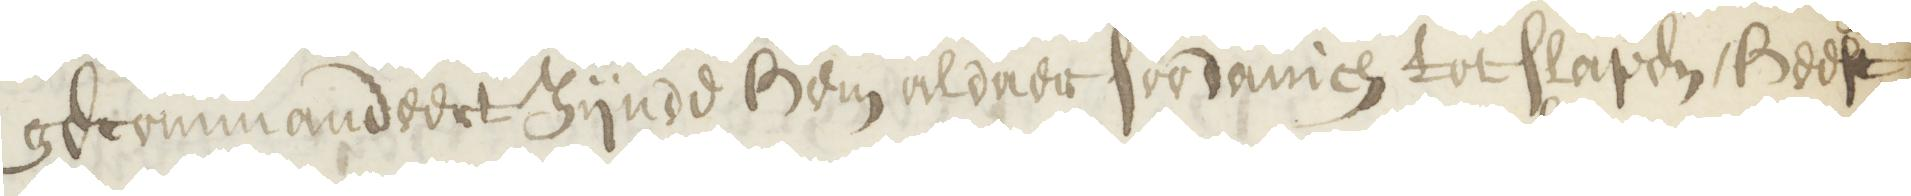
gecommandeert sijnde hem aldaer soodanich tot slapen/ heeft
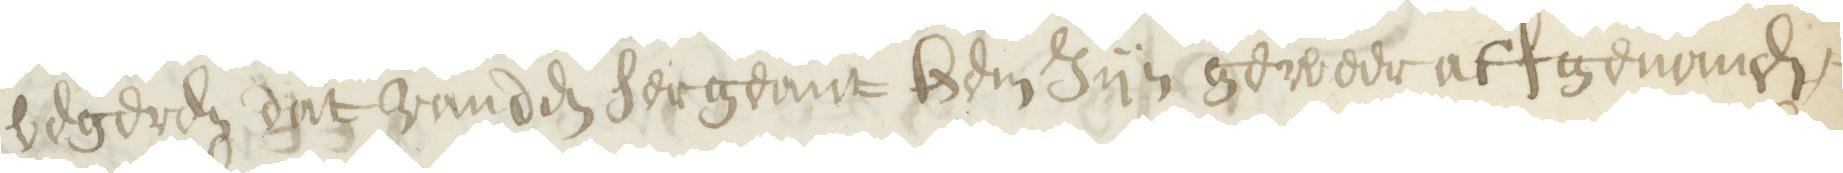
begeren dat van den sergeant hem zijn geweer affgenomen,
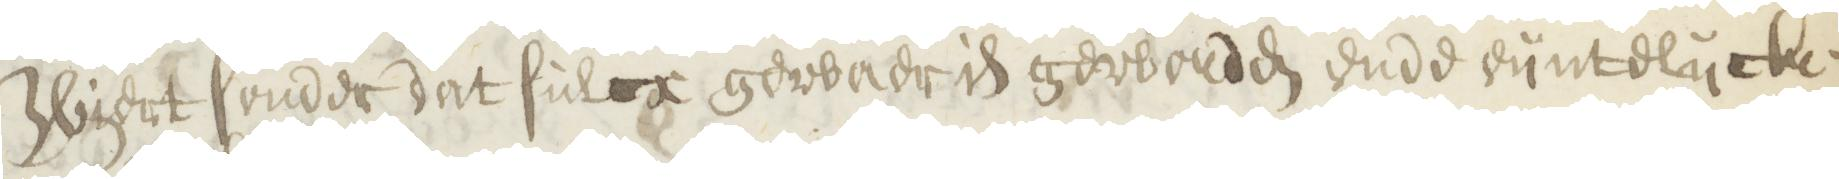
Wiert sonder dat sulcx gewaer is geworden ende eijntelijck
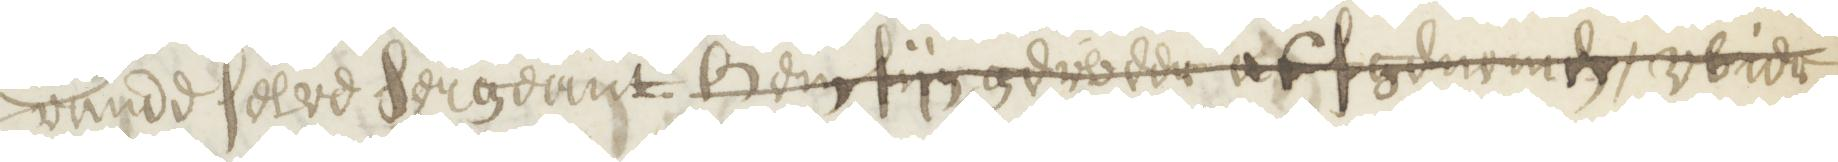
vande selve sergeant hem sijn geweer affgenomen wier
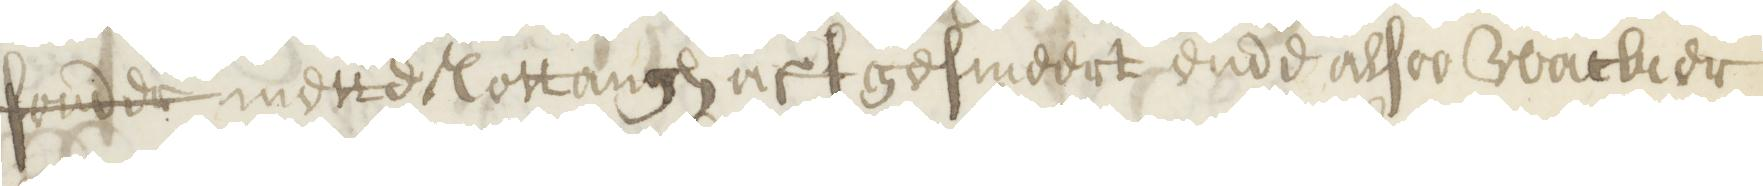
sonder mette rottangh affgesmeert ende alsoo wacker
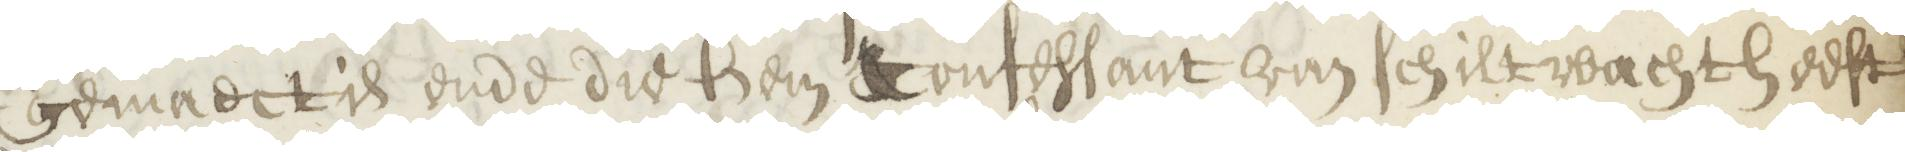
gemaect is ende die hem confessant van schiltwacht heeft
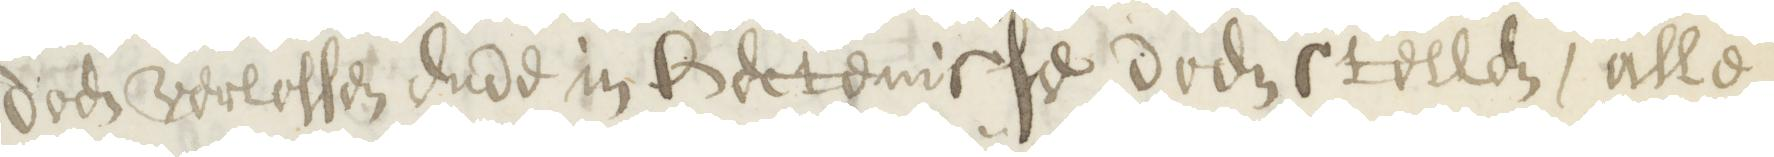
doen verlossen ende in Hectenisse doen stellen, alle
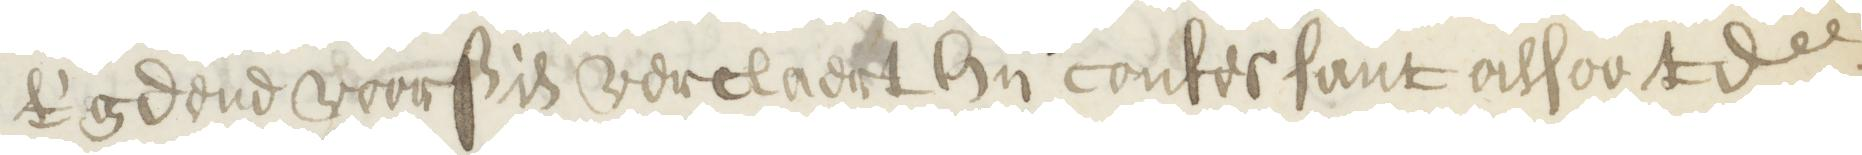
t' geene voorsz is verclaert hij confessant alsoo te
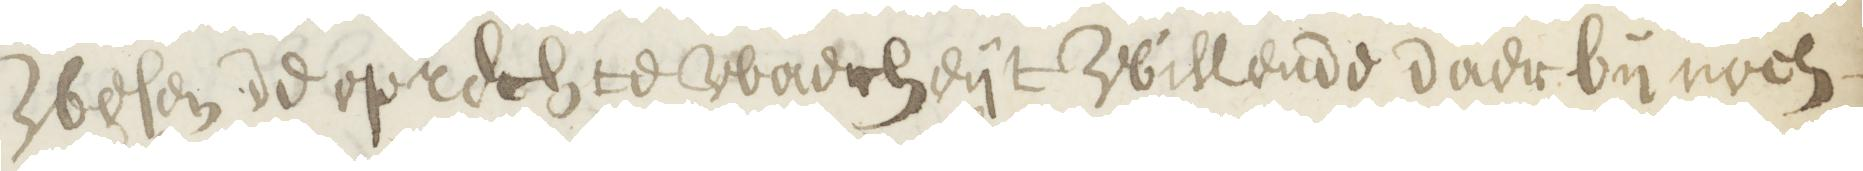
wesen de oprechte waerheijt willende daer bij noch
